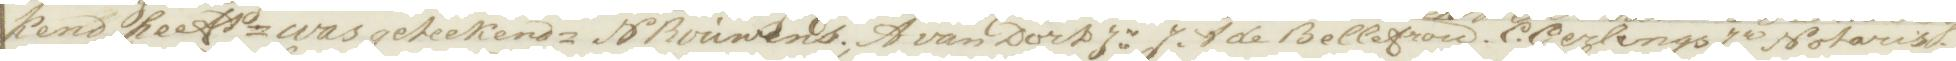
Kend heeft = was geteekend = N Rouwens, A van Dort J„r J. A de Bellefroid, C. Gerlings J„r Notaris.
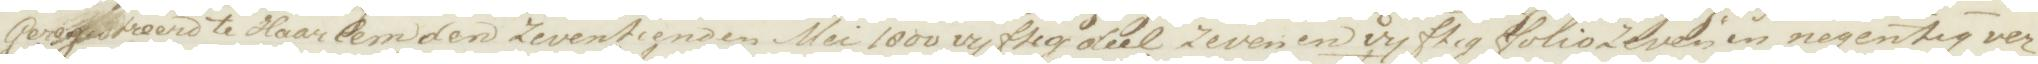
Geregistreerd te Haarlem den zeventienden Mei 1800 vyftig deel zeven en vyftig folio zeven en negentig ver
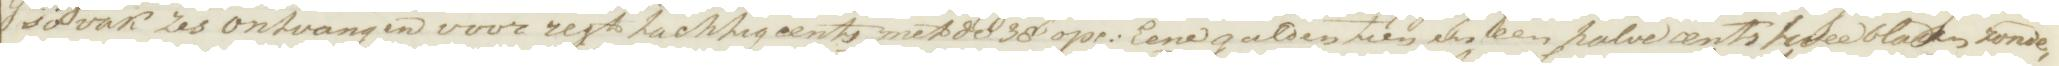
so vak zes ontvangen voor regt tachtig cents met de 38 opc: Eene gulden tien en een halve cents twee bladen zonder
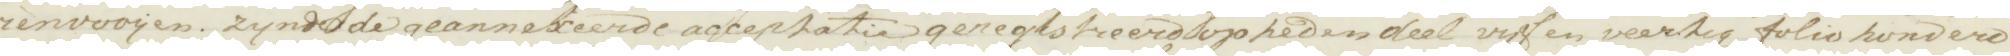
renvooijen, zynde de geannexeerde acceptatie geregistreerd op heden deel vyf en veertig folio honderd
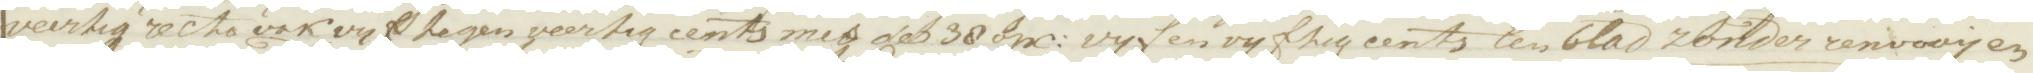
veertig recto vak vyf tegen veertig cents met de 38 opc: vyf en vyftig cents Een blad zonder renvooijen
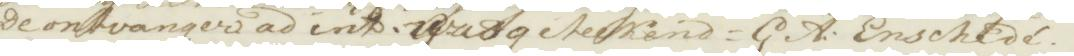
de ontvanger ad int. was geteekend = G A: Enschedé.
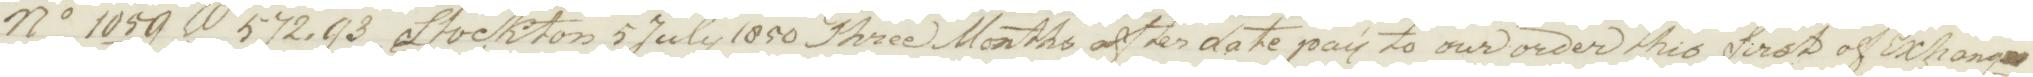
No 1059 @ 572.93 Stockton 5 July 1850 Three Months after date paij to our order this first of Exhanges
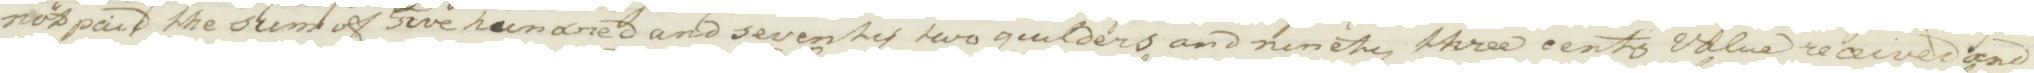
not paid the sum of five hundred and seventy two guilders and ninety three cents value received and
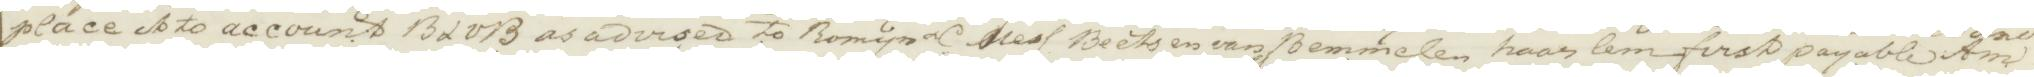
place it to account B20B as advised to Romyn & C Mess Beets en van Bemmelen haarlem first payable Am
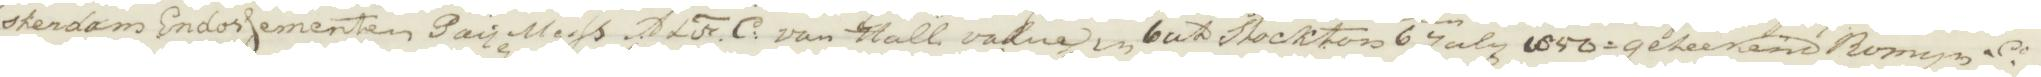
sterdam Endossementen Paij Mess A. F. C: van Hall value in but Stockton 6 July 1850 = geteekend Romyn C.o
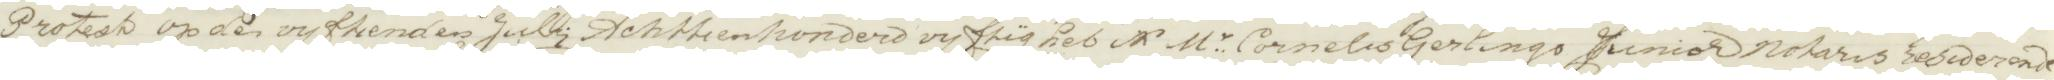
Protest op den vyftienden Julij Achttienhonderd vyftig heb ik M„r Cornelis Gerlings Junior Notaris residerende
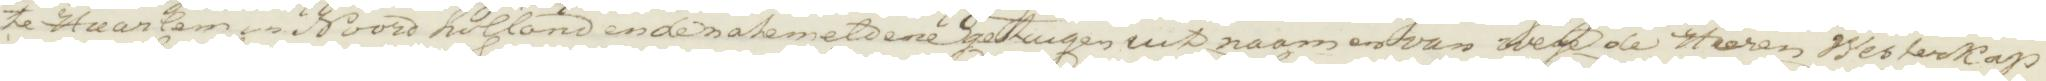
te Haarlem in Noord holland en de natemeldene getuigen uit naam en van wege de Heeren Westerkap
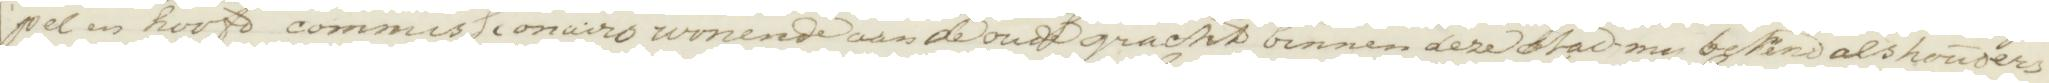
pel en hoofd commissionairs wonende aan de oude gracht binnen deze stad my bekend als houders
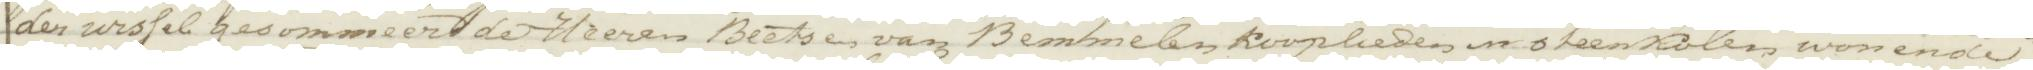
der wissel gesommeerd de Heeren Beets en van Bemmelen kooplieden in steenkolen wonende
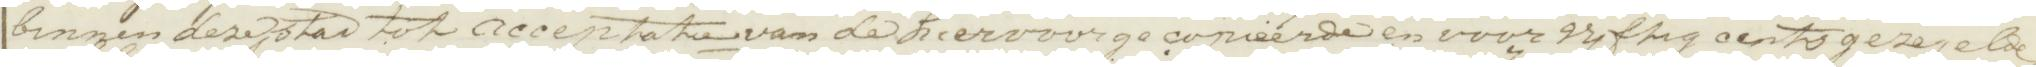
binnen deze stad tot acceptatie van de hiervoor gecopieerde en voor vyftig cents gezegelde
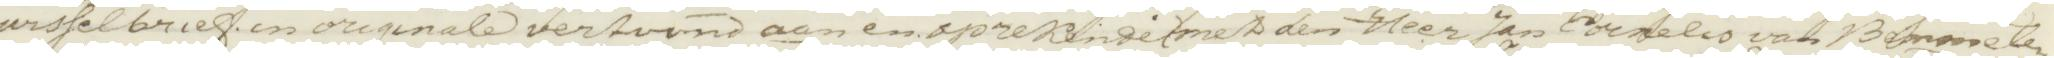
wisselbrief in originale vertoond aan en sprekende met den Heer Jan Cornelis van Bemmelen
